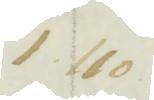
1.40
